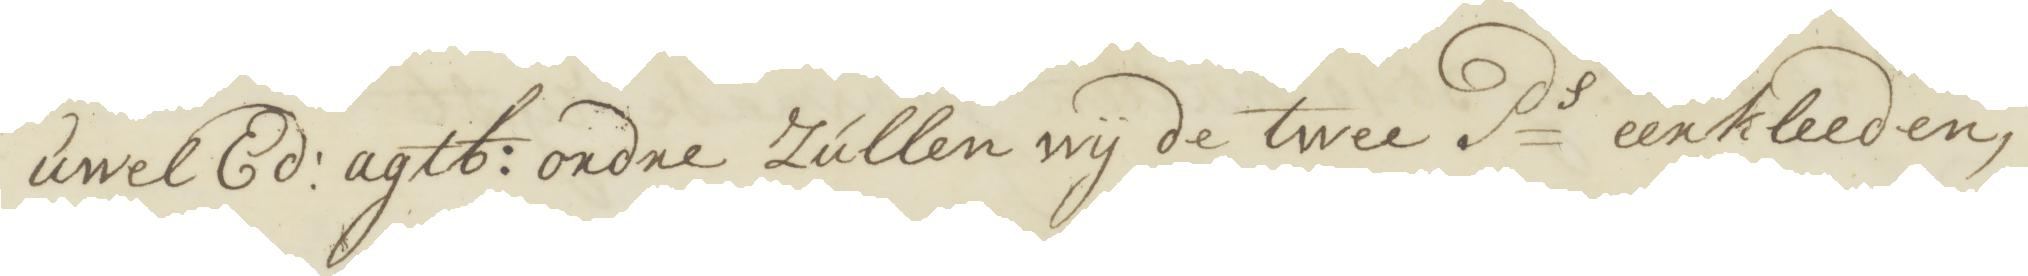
uwel Ed: agtb: ordre zullen wij de twee P=s eerkleeden,
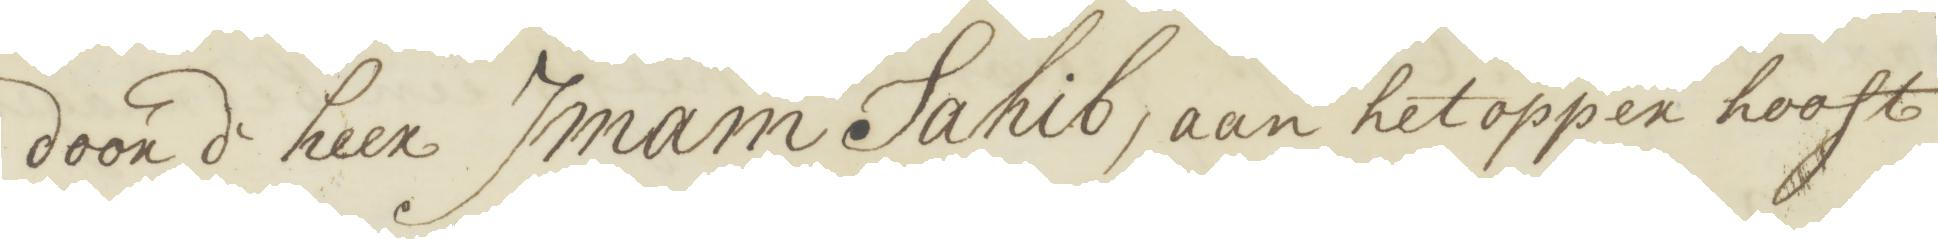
door d’ heer Jmam Sahib, aan het opper hooft
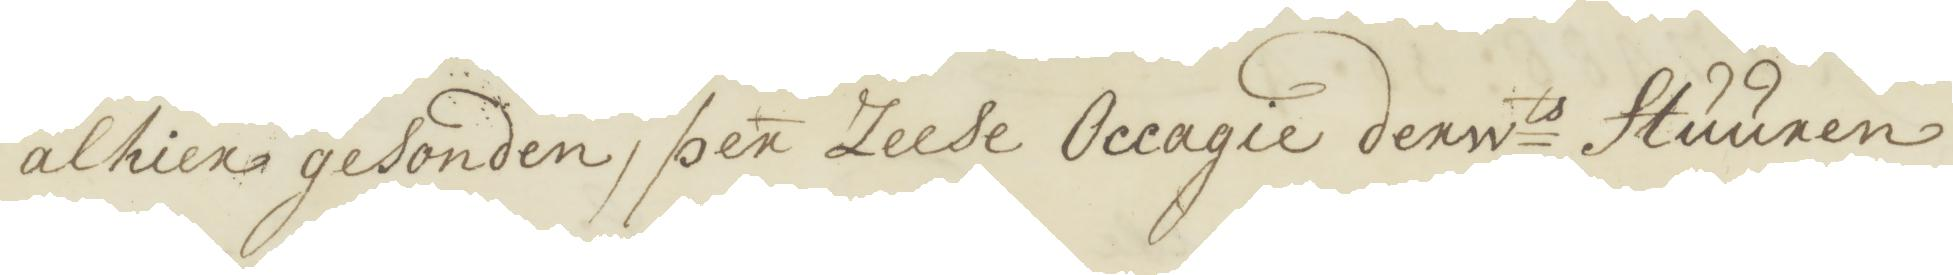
alhier gesonden, per zeese Occagie derw=ts stuuren
